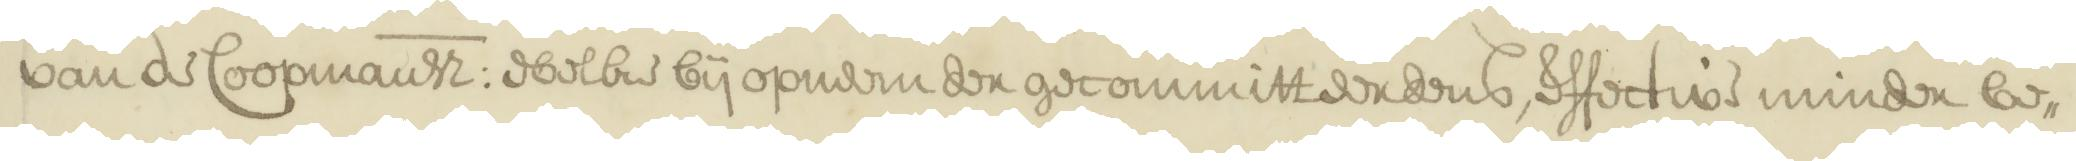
van de Coopmansz: welke bij opneem der gecommitteerdens, Effective minder be„
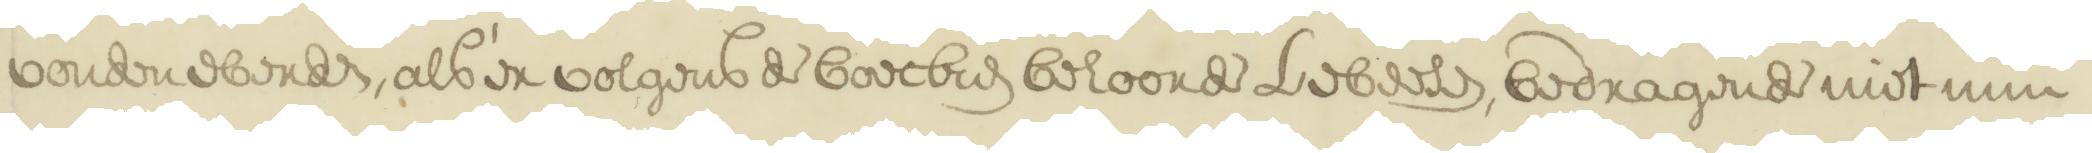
vonden werden, als er volgens de boecken behoorde te weesen, bedragende niet min
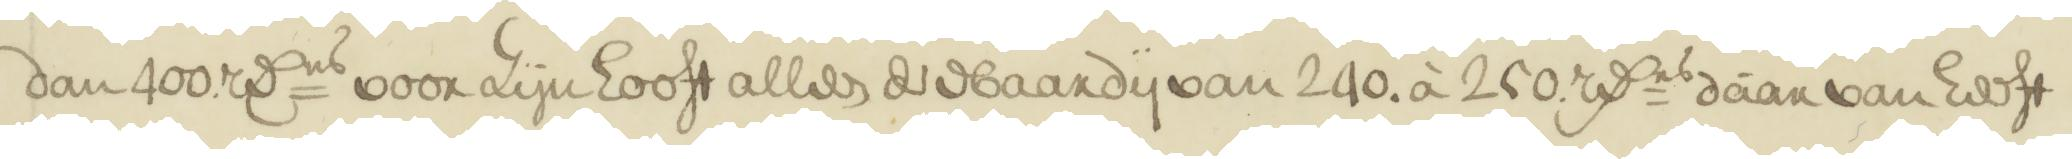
dan 400. rx=rs voor Zijn hooft alleen de waardij van 240. â 250. rx:rs daar van heeft
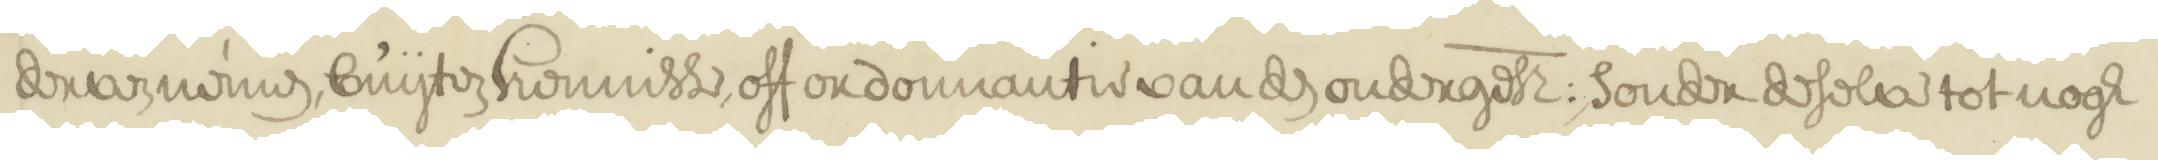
derven nemen, buijten kennisse, off ordonnantie van den ondergesz: sonder deselve tot nogh
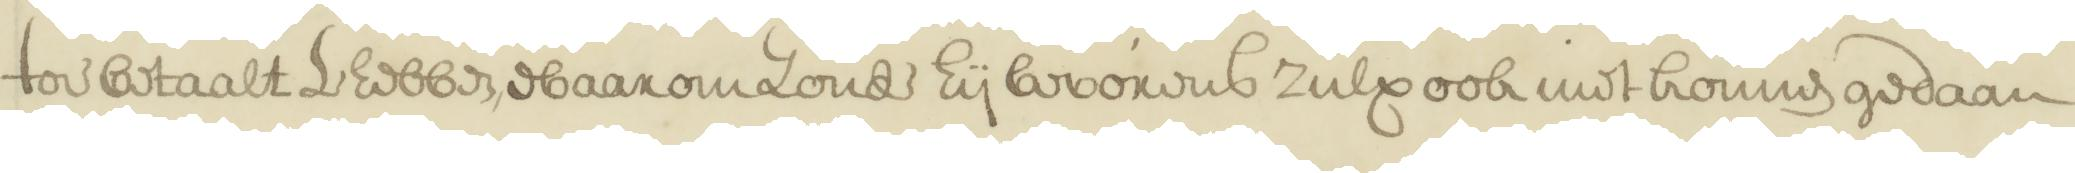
toe betaalt te hebben, waarom Zoude hij bevorens Zulx ook niet konnen gedaan
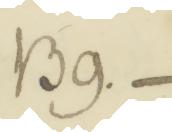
139.—
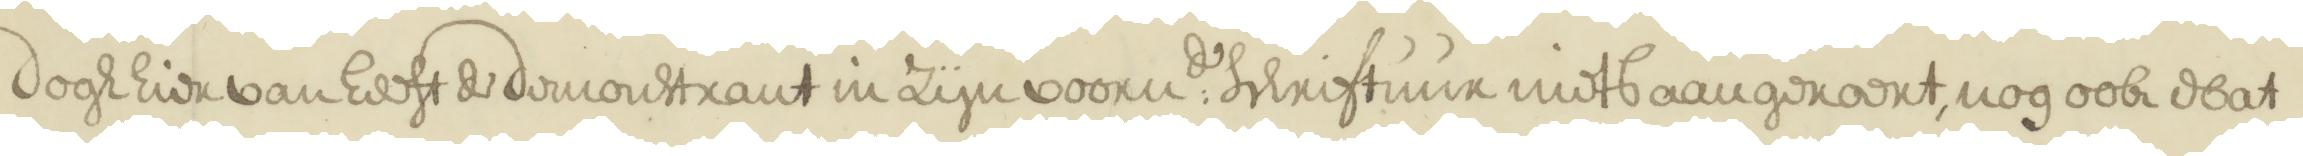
Dogh hier van heeft de demonstrant in Zijn voorn:de schriftuur niets aangeroert, nog ook wat
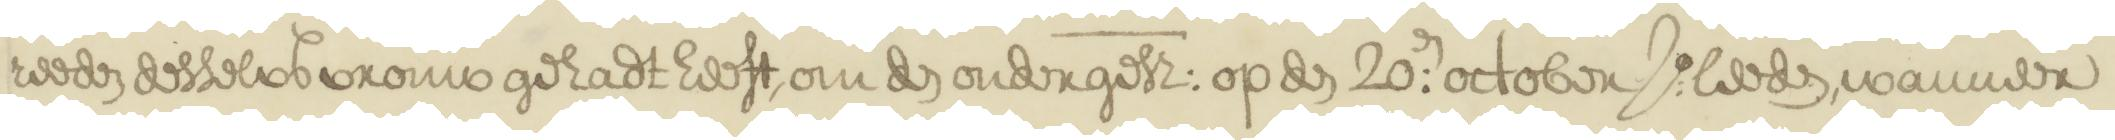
reeden desselvs vrouw gehadt heeft, om den ondergesz: op den 20:en october J:o leeden, wanneer
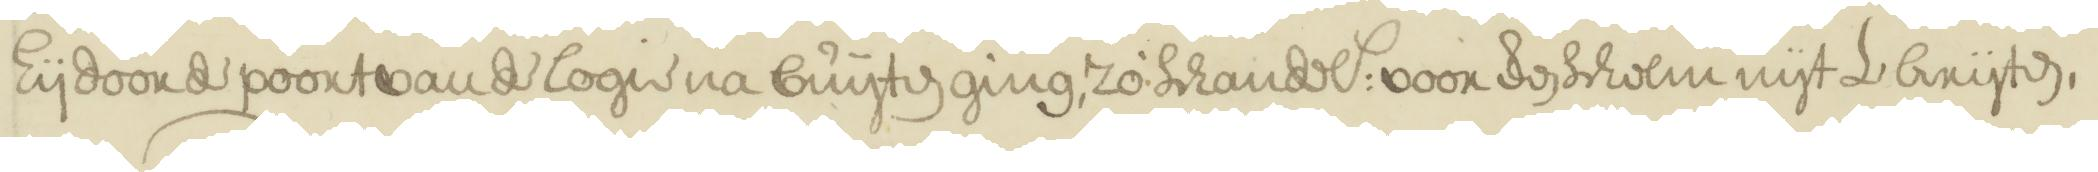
hij door de poort van de logie na buijten ging, zo: schandelijk voor een schelm uijt te krijten,
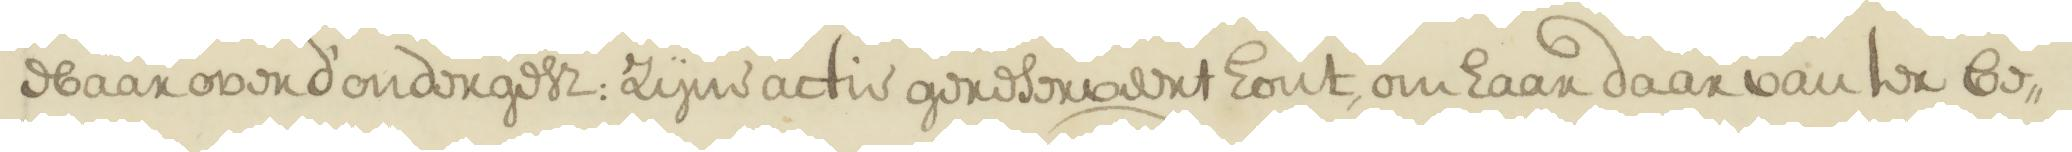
waar over d’ ondergesz: Zijne actie gereserveert hout, om haar daar van ter be„
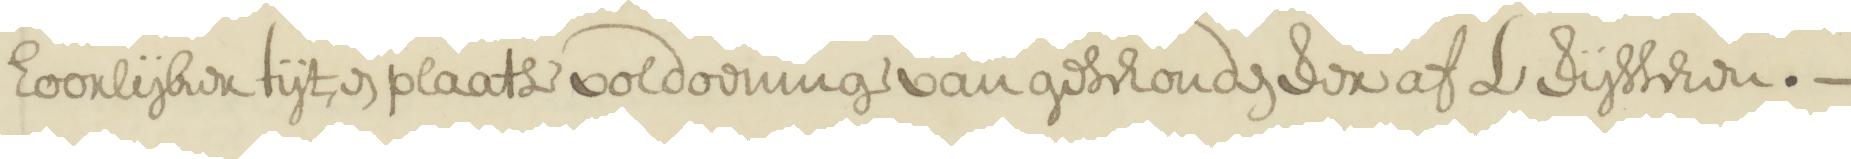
hoorlijker tijt, en plaatse voldoening van geschonden Eer af te Eijsschen.—
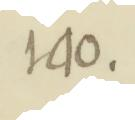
140.
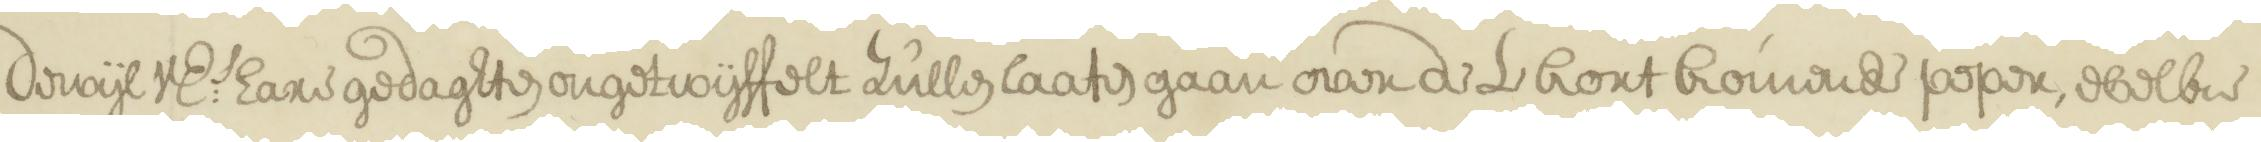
dewijl VE: hare gedaghten ongetwijffelt Zullen laaten gaan over de te kort komende peper, welke
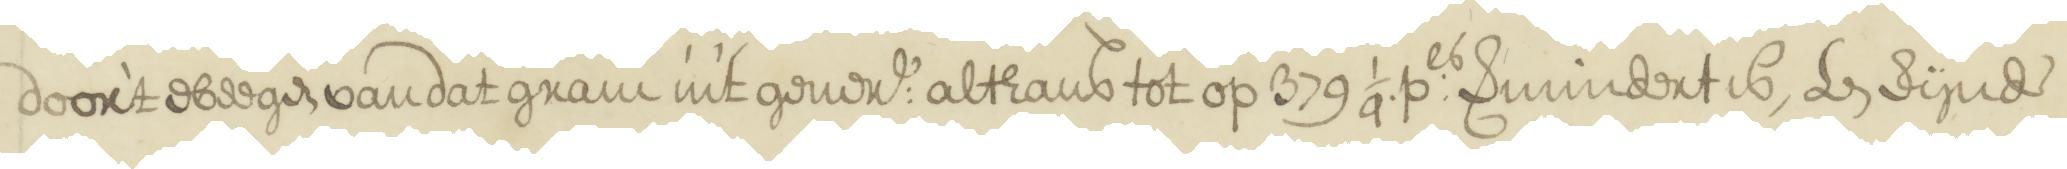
door ’t weegen van dat grain uit gener:e althans tot op 379¼. p:ls vermindert is, ten Eijnde
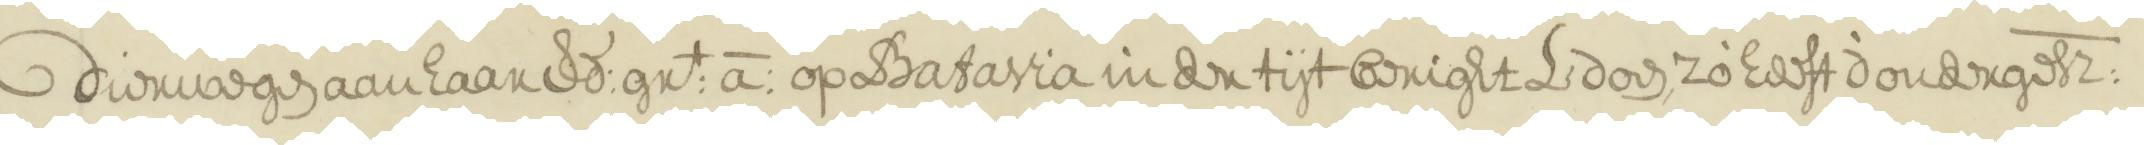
dierwegen aan haar Ed: gr:t a: op Batavia in der tijt beright te doen zo heeft d'ondergesz:
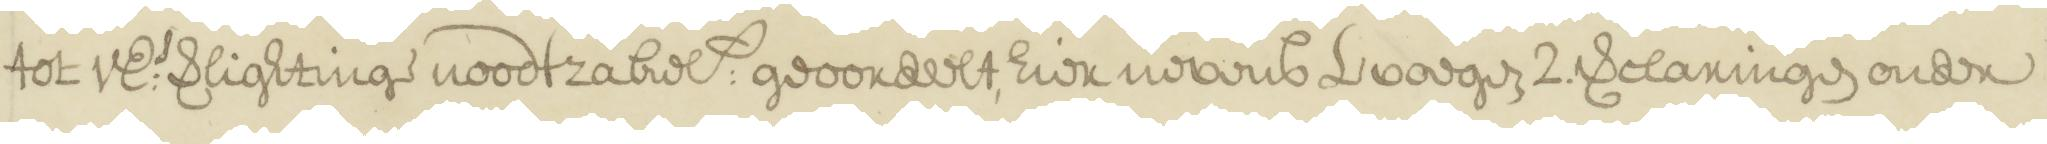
tot vE:s verlightinge noodtzakelijk geoordeelt, hier nevens te voegen 2. verclaringen onder
